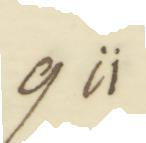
911
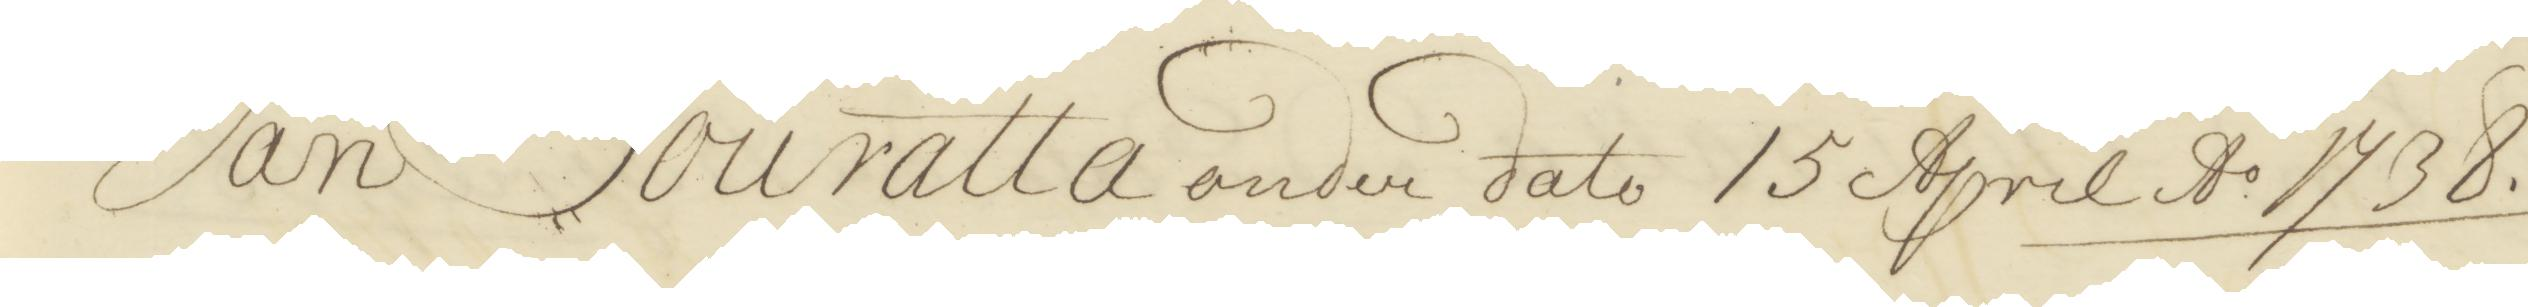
Van Souratta onder dato 15 April A.o 1738.
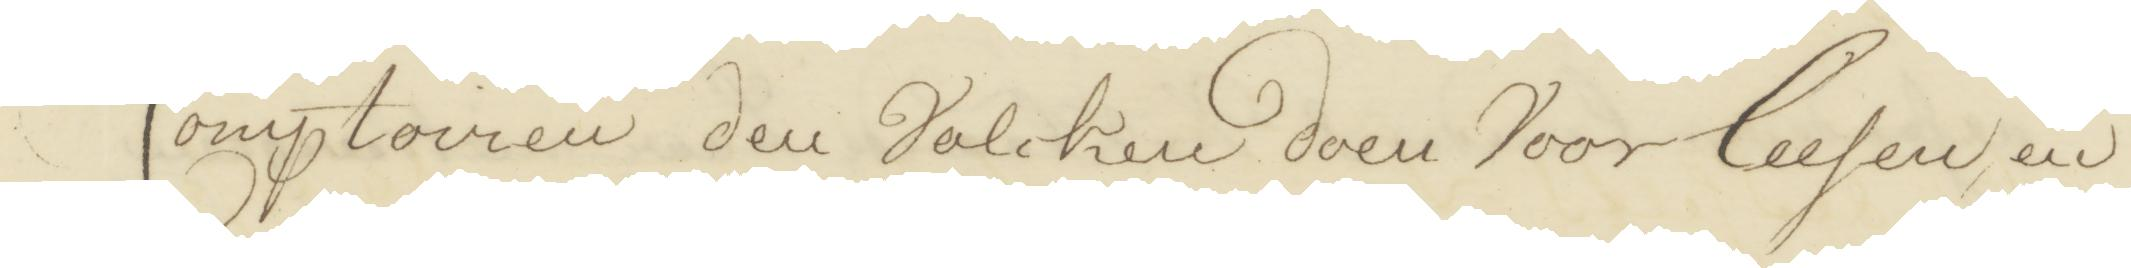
Comptoiren den Volcken doen Voor Leesen, en
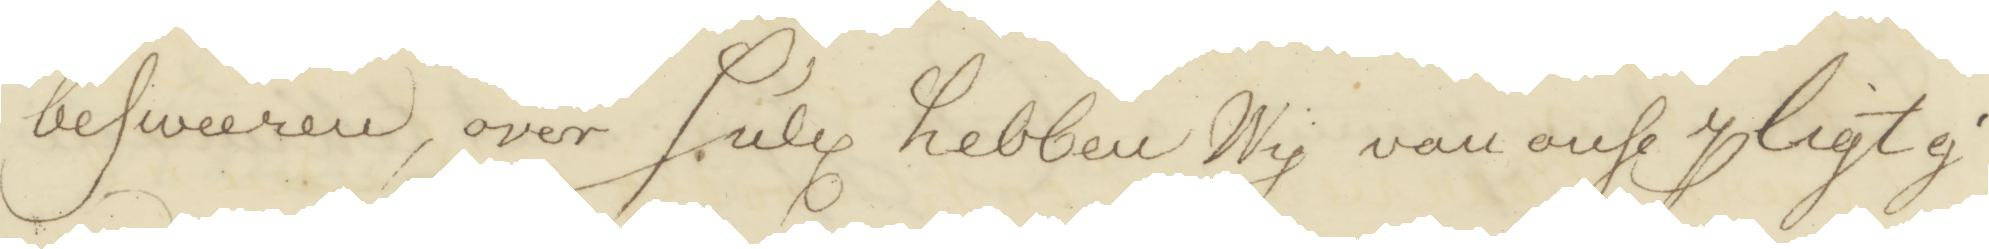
besweeren, over Sulx hebben Wij van onse pligt g'
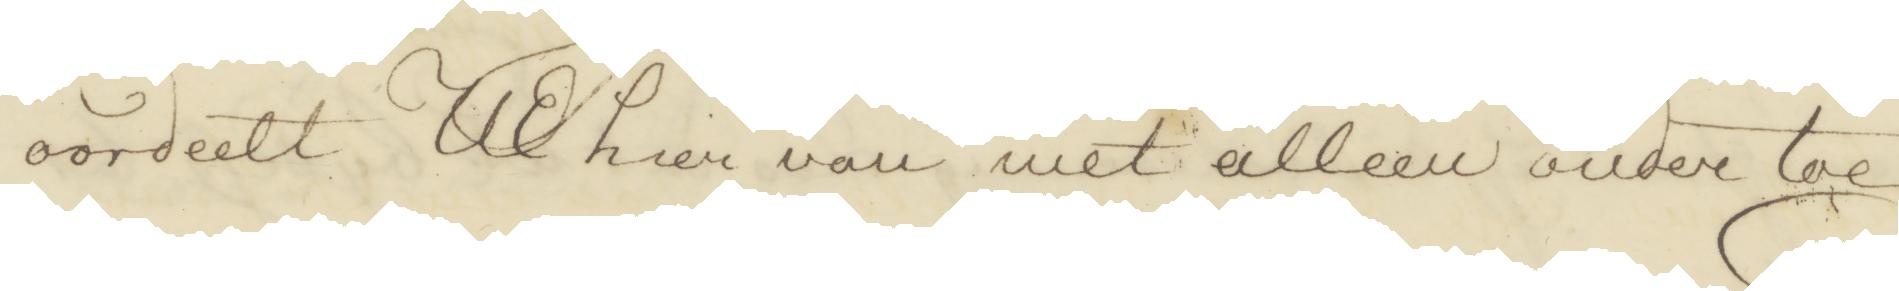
oordeelt UE hier van niet alleen onder toe
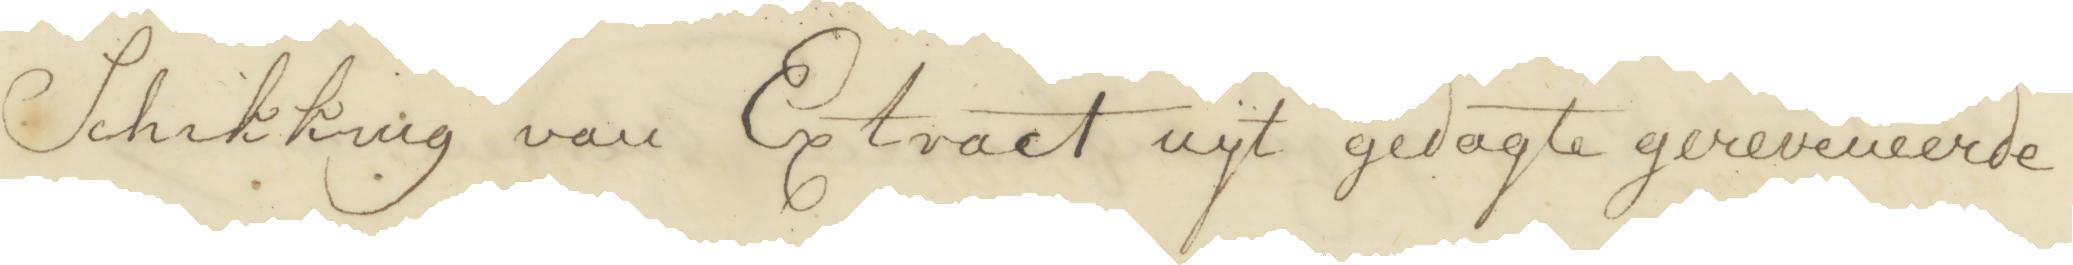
schikking van Extract uijt gedagte gereveneerde
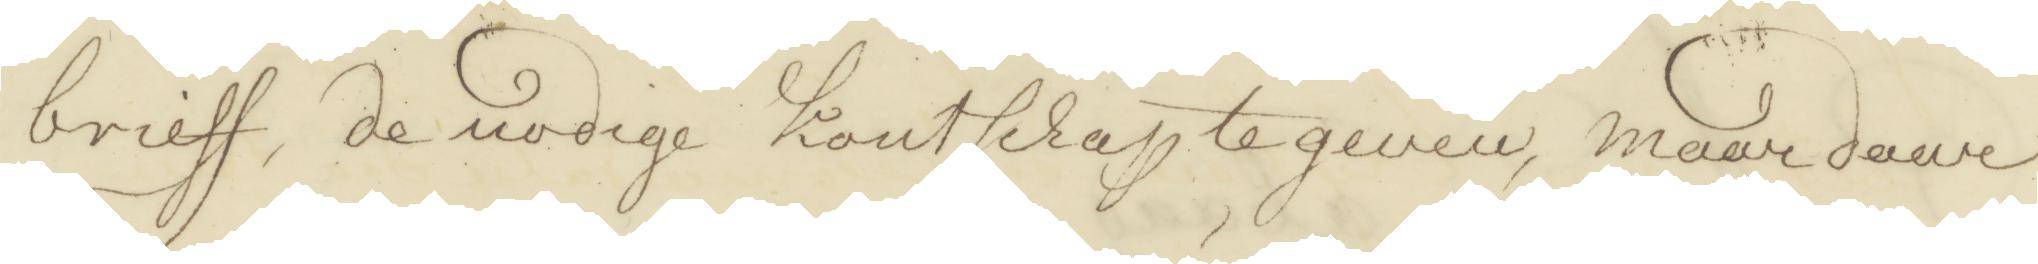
brieff, de nodige kontschap te geven, maar daar
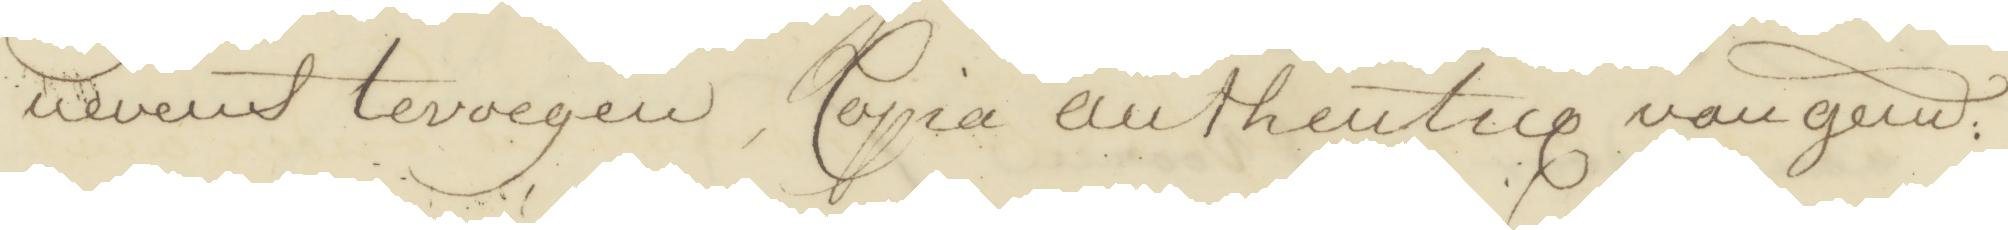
nevens tevoegen, Copia authenticx van gem:
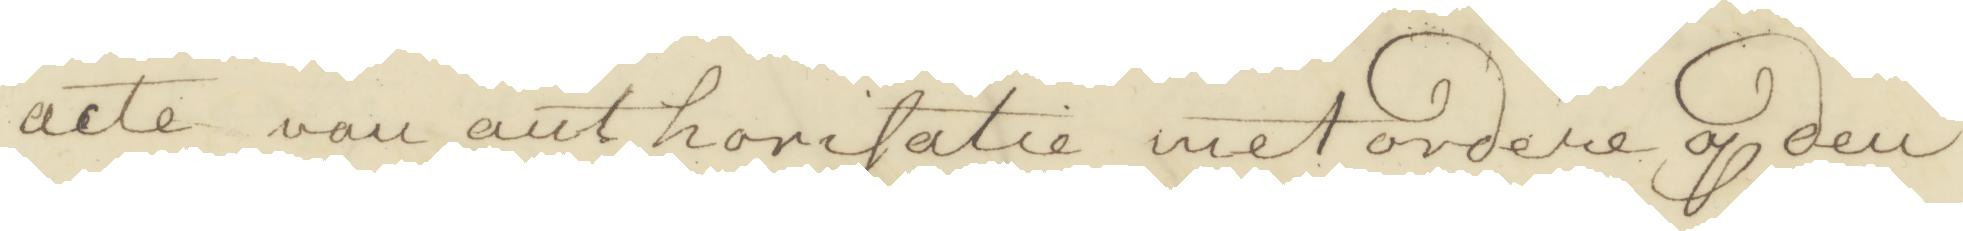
acte van authorisatie met ordere op den
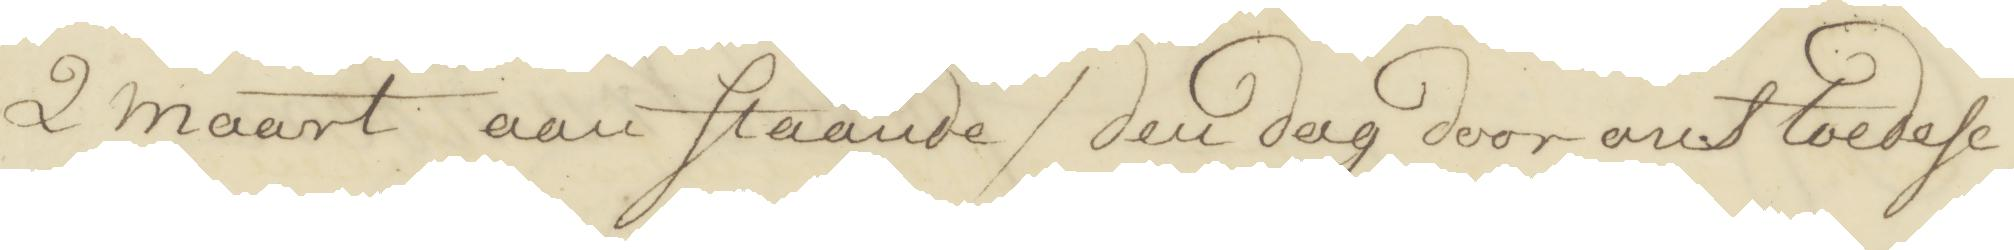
2 maart aan staande / den dag door ons toedese
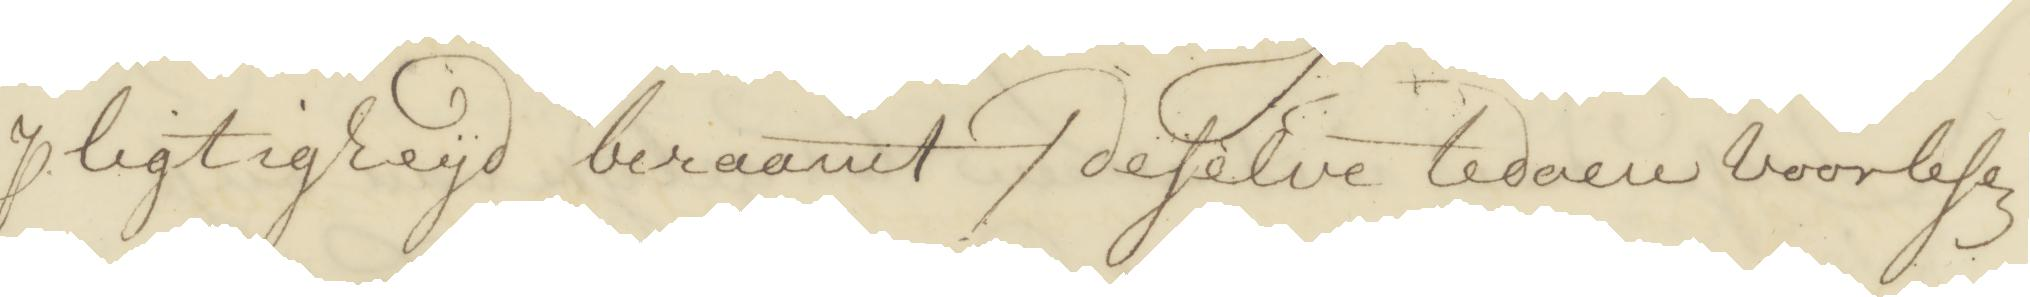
pligtigheijd beraamt / deselve tedoen Voorlesen
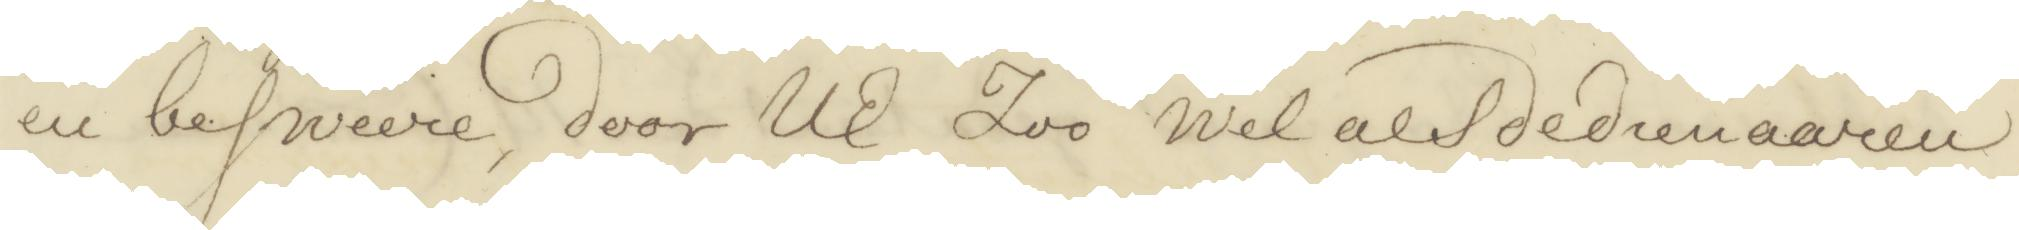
en besweere, door UE zoo wel als dedienaaren
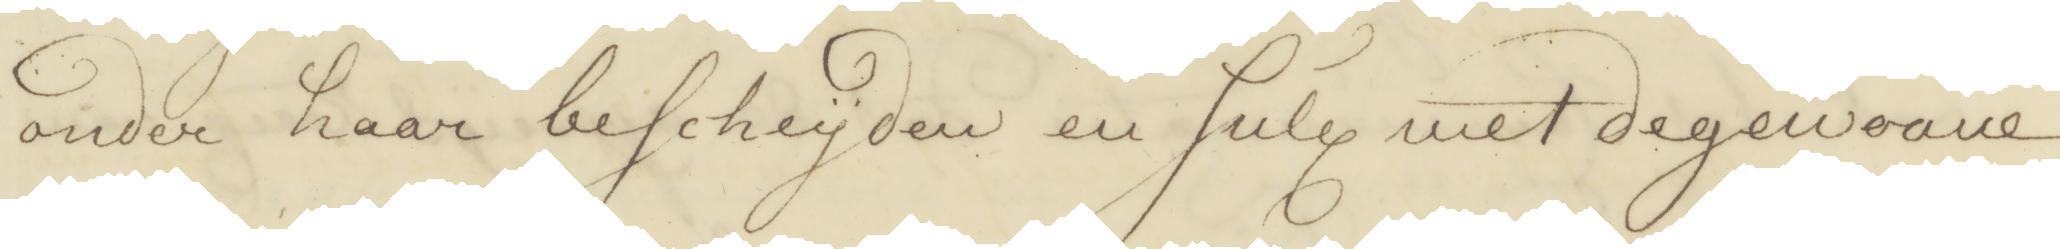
onder haar bescheijden en sulx met degewoone
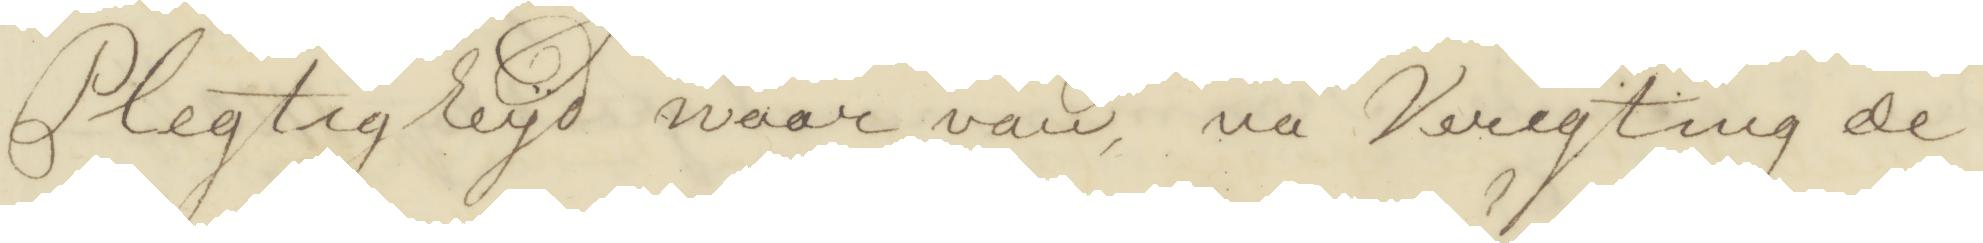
Plegtigheijd waar van, na Veregting de
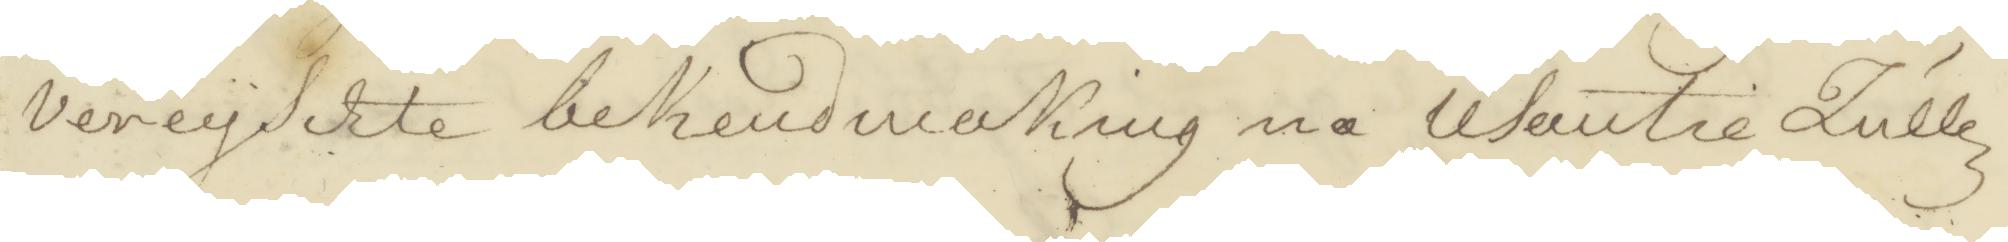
vereijschte bekendmaking na usantie zullen
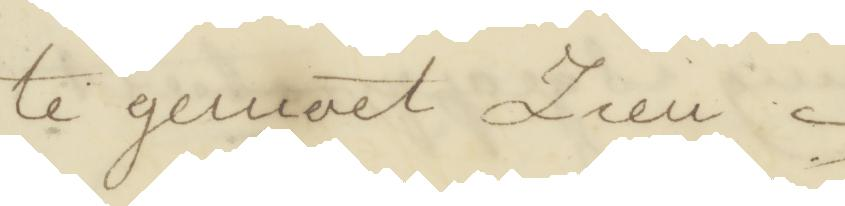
te gemoet zien —.
